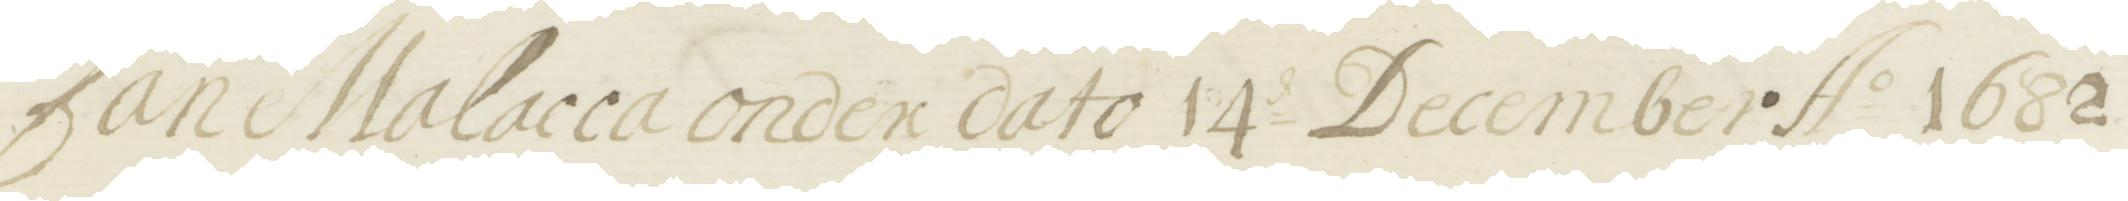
Van Malacca onder dato 14=e December A=o 1682
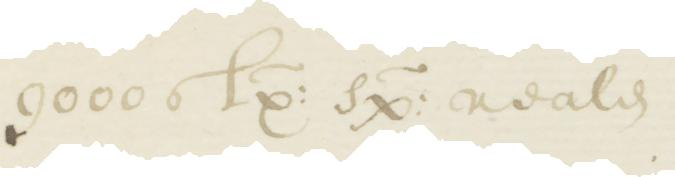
9000 stx: sp: realen
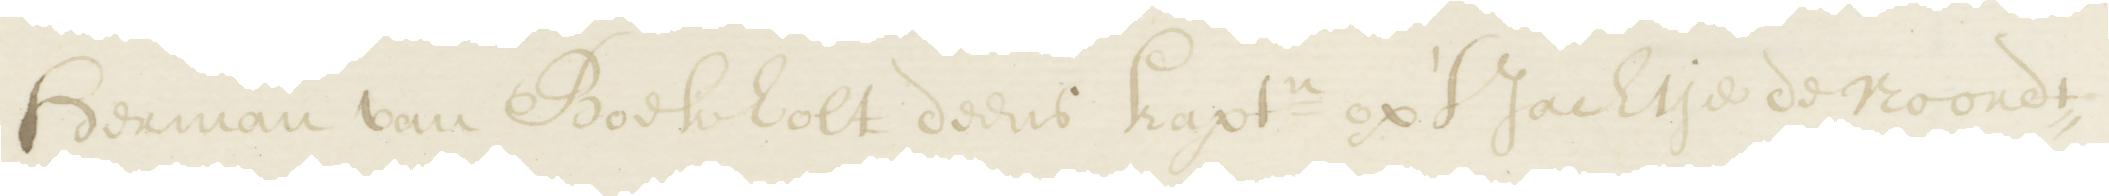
Herman van Boekholt deens kapt=n op 't Jachtje de noordt„
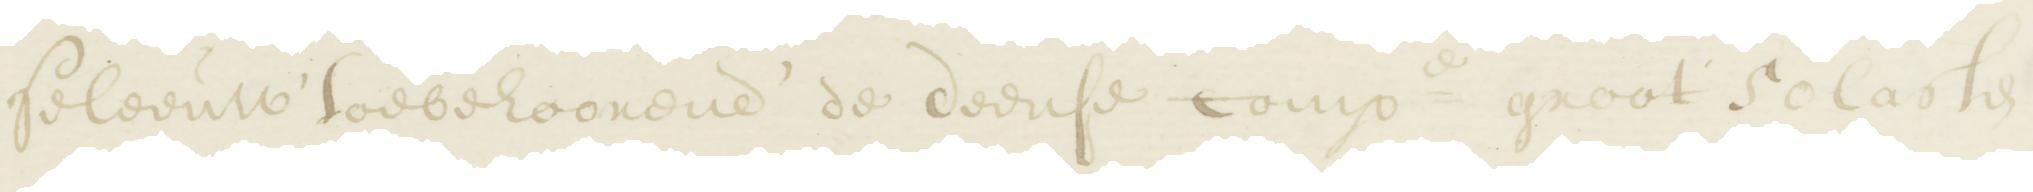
se leeuw 'toebehoorend' de deense comp=e groot 50 lasten
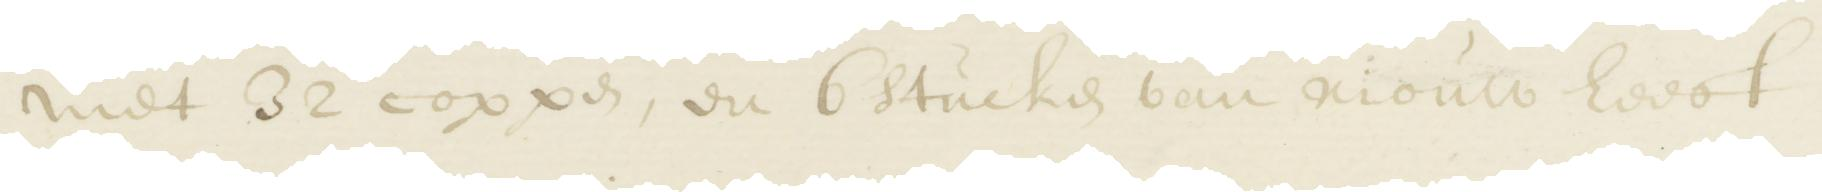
met 32 coppen, en 6 stucken van riouw heeft
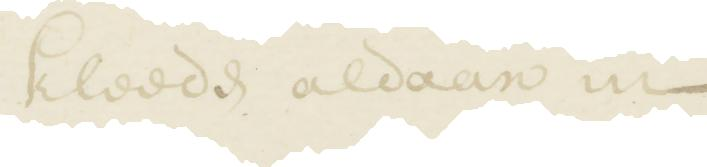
kleeden aldaar in
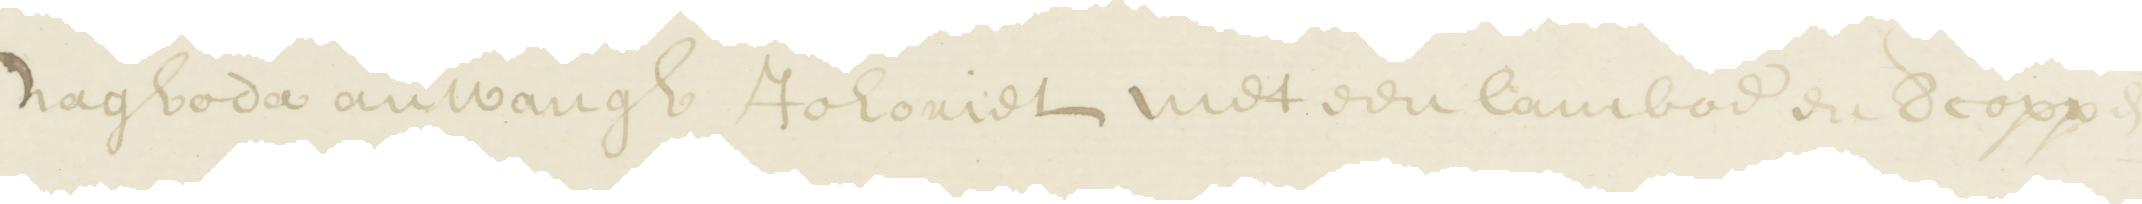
naghoda auwangh Johoriet met een lamboe en 8 coppen
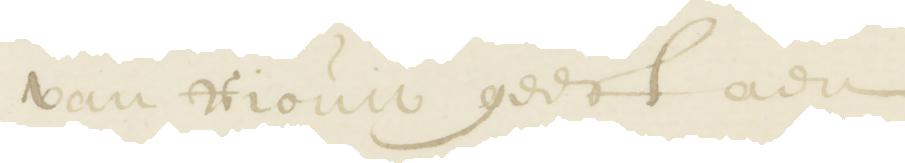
van riouw geeft aen
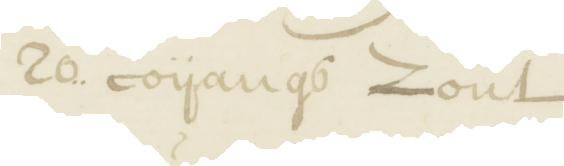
20. coijangs zout
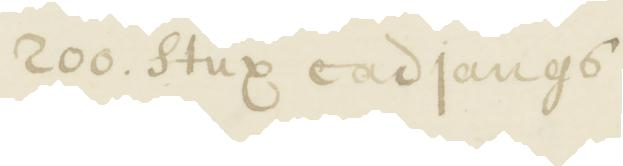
200. stux cadjangs
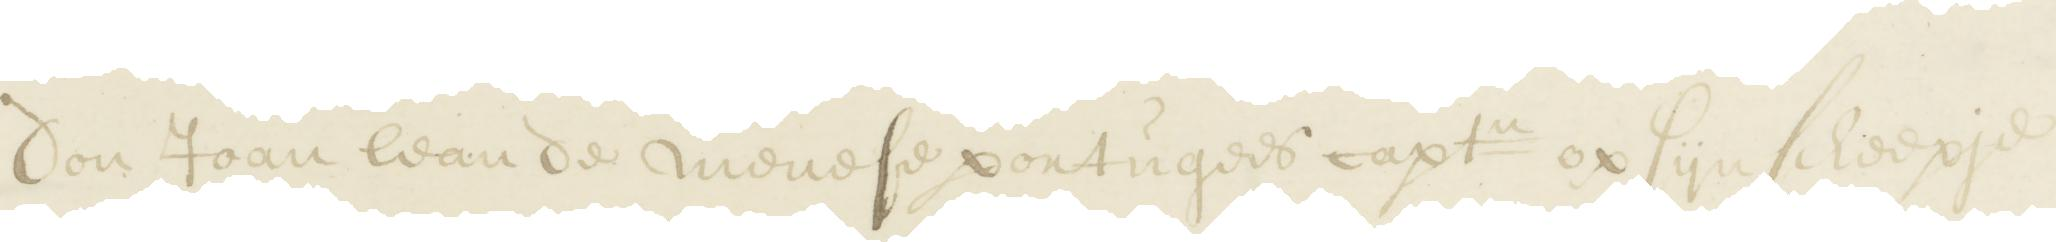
Don Joan lean de menese portugees capt=n op sijn scheepje
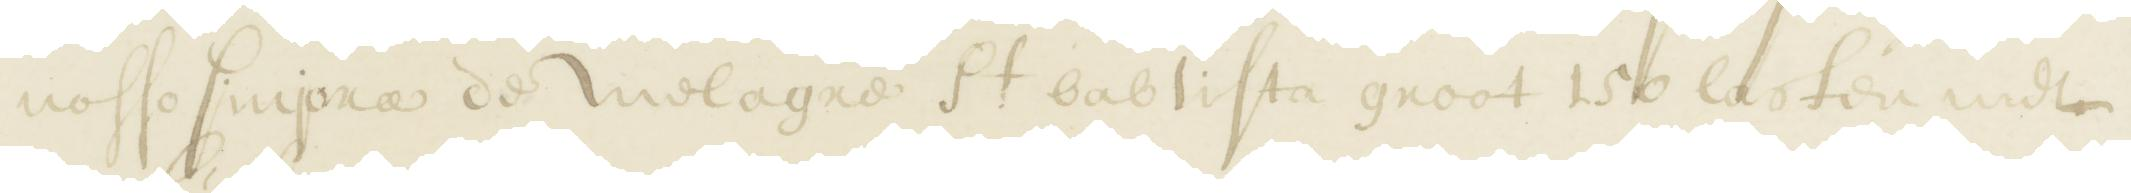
nosso sinpra de melagre S:t babtista groot 150 lasten met
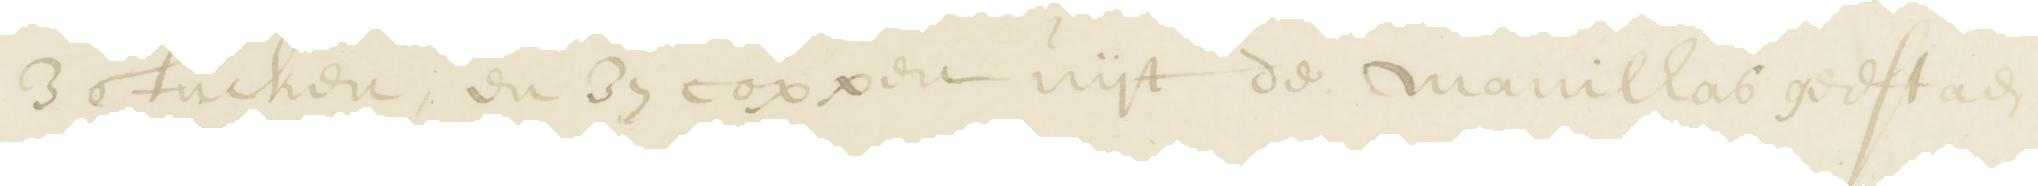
30 stucken, en 37 coppen uijt de manillas geeft aen
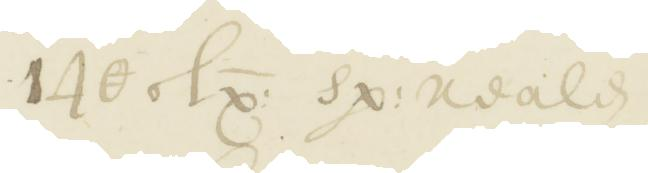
140 stx: sp: realen
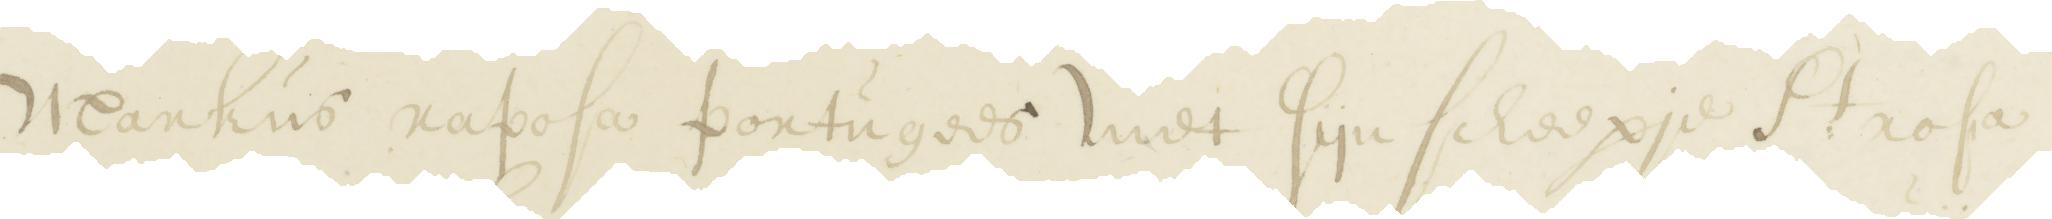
Markus raposa portugees met sijn scheepje S:t rosa
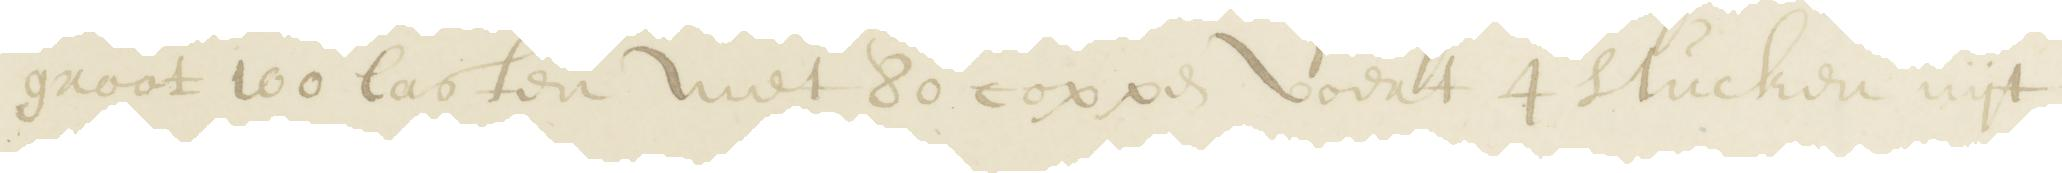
groot 100 lasten met 80 coppen voert 4 stucken uijt
